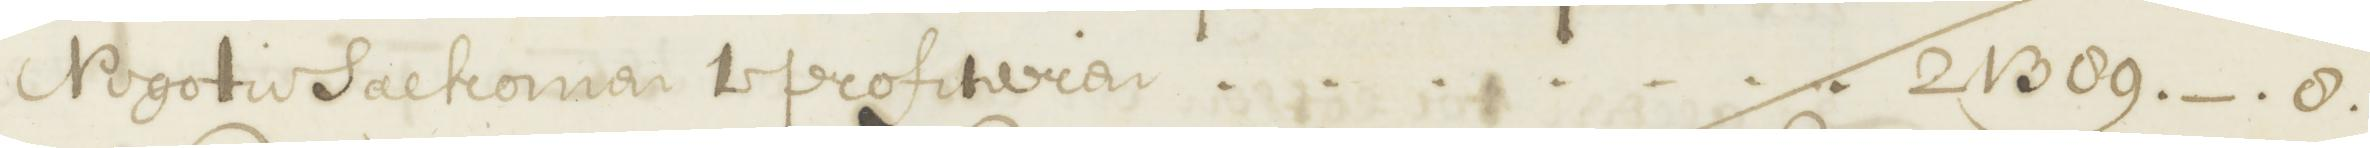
Negotie sal komen te profiteeren . . . . . . ƒ 21389._.8.
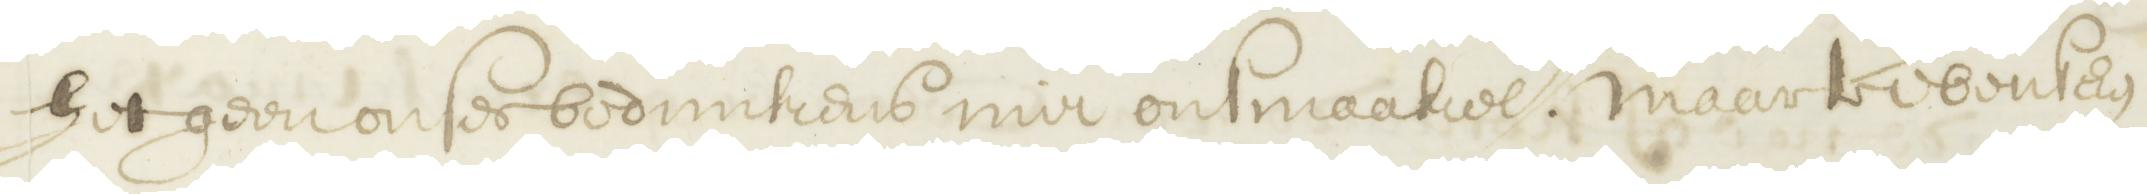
het geen onses bedunkens niet onsmaakelijk maar te wenschen
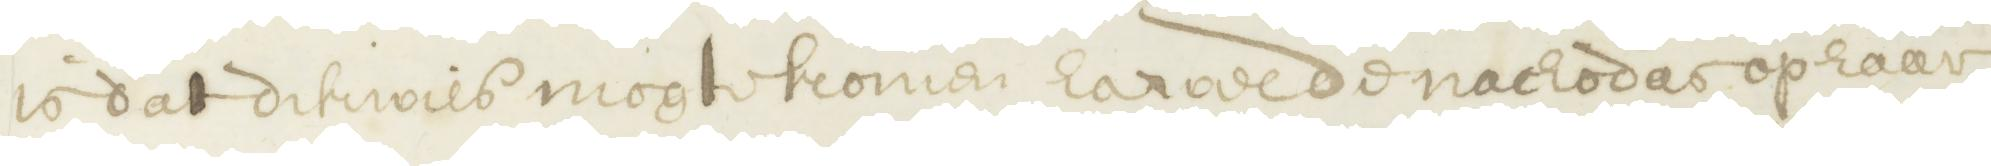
is dat dikwils mogte komen hoewel de nachodas op haar
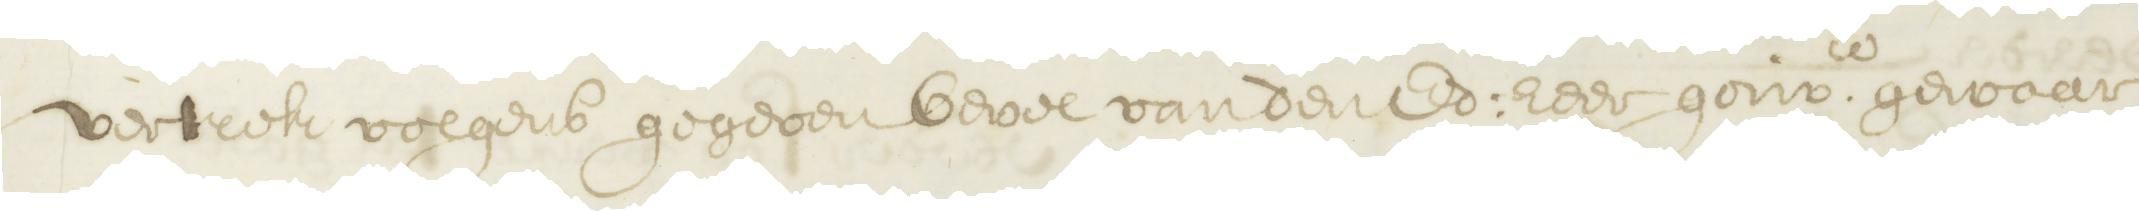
vertrek volgens gegeven bevel van den Ed: heer gouv.' gewaar
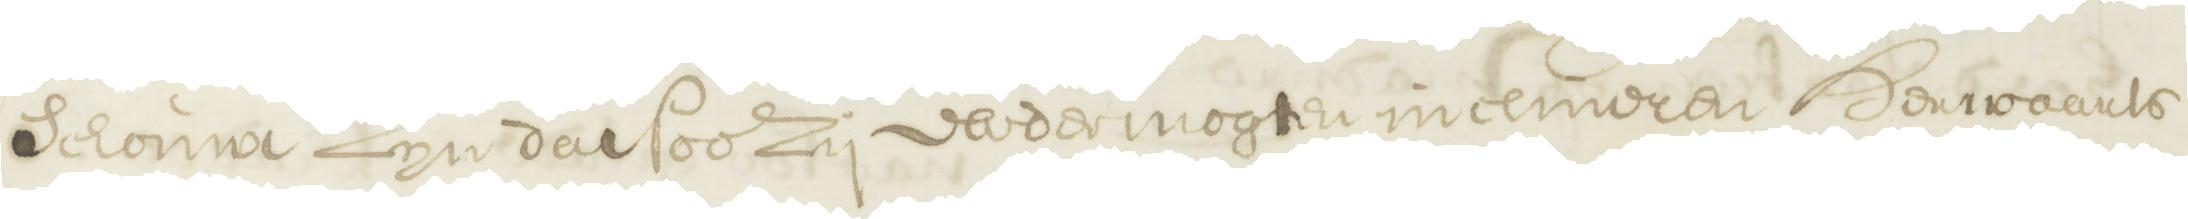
schouwt zijn dat soo zij weder mogten inclineren Herwaarts
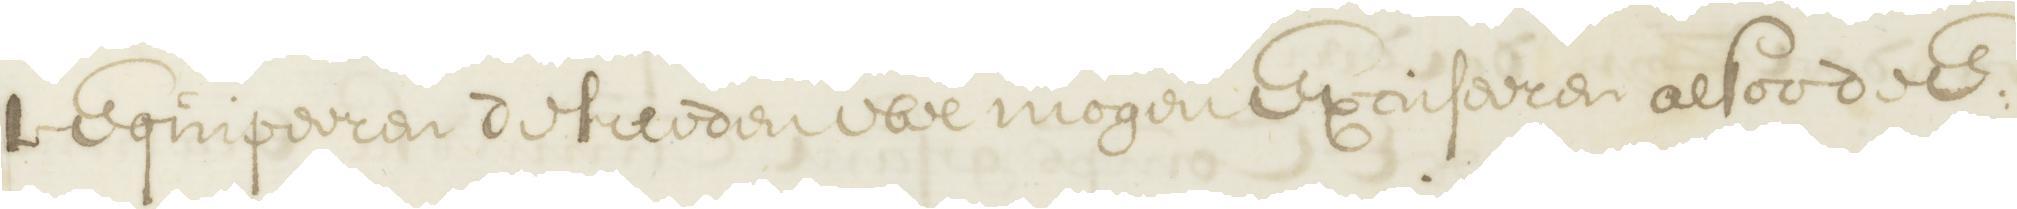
te Equipeeren de kleden wel mogen Excuseeren alsoo de E.
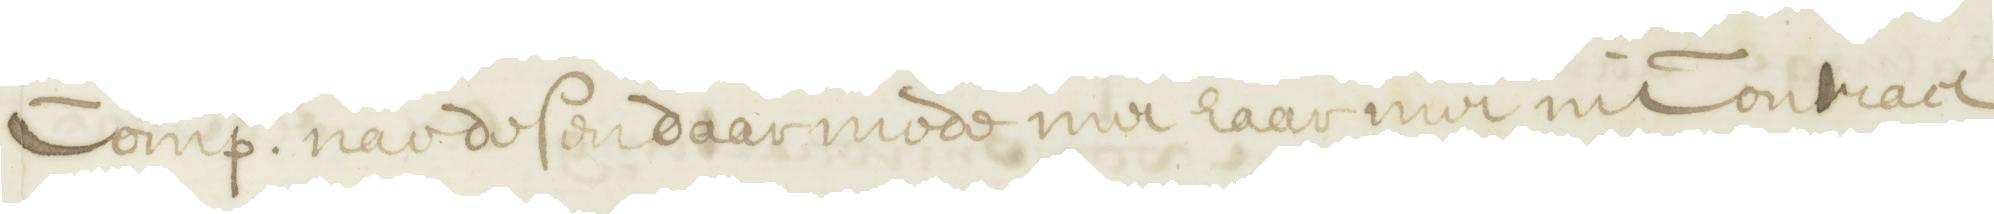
Comp. nae desen daar mede met haar niet in Contract
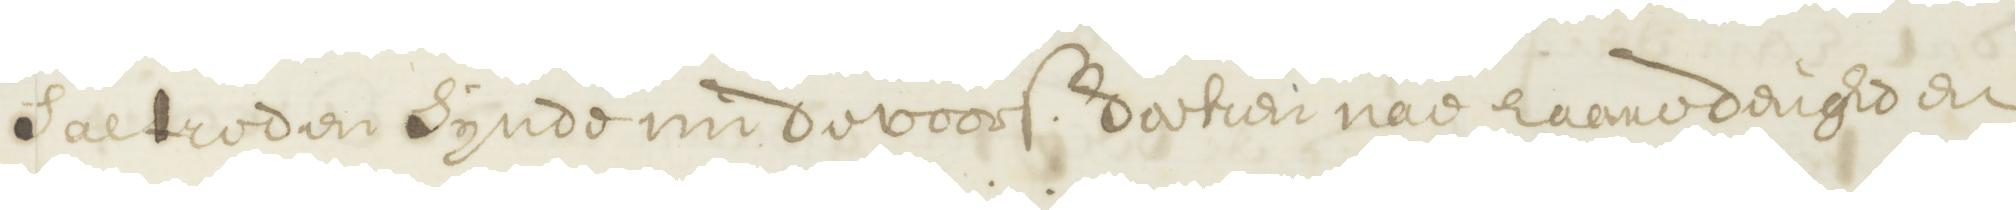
sal treden sijnde nu de voors: doeken nae haare deughd en
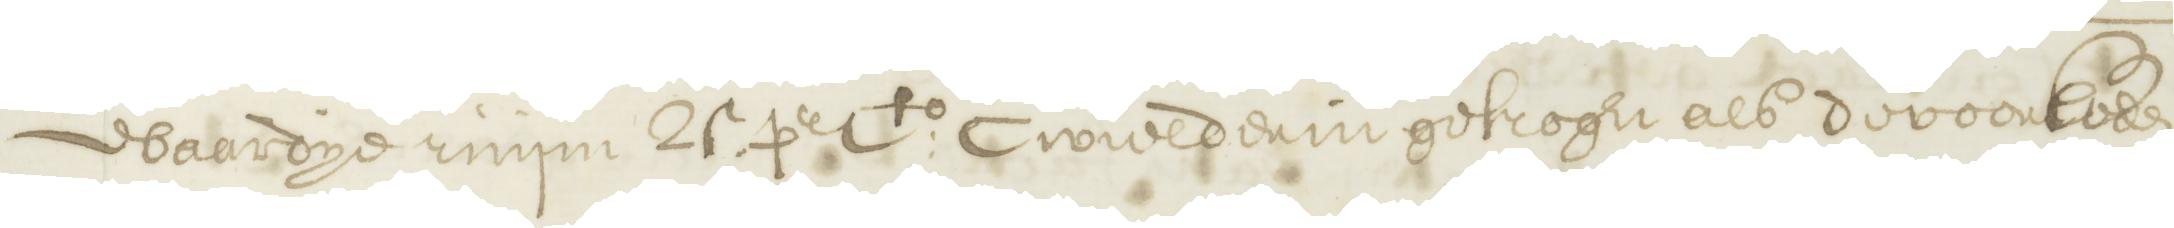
waardije ruijm 25. prC:to Civiel der in gekoght als de voorleden
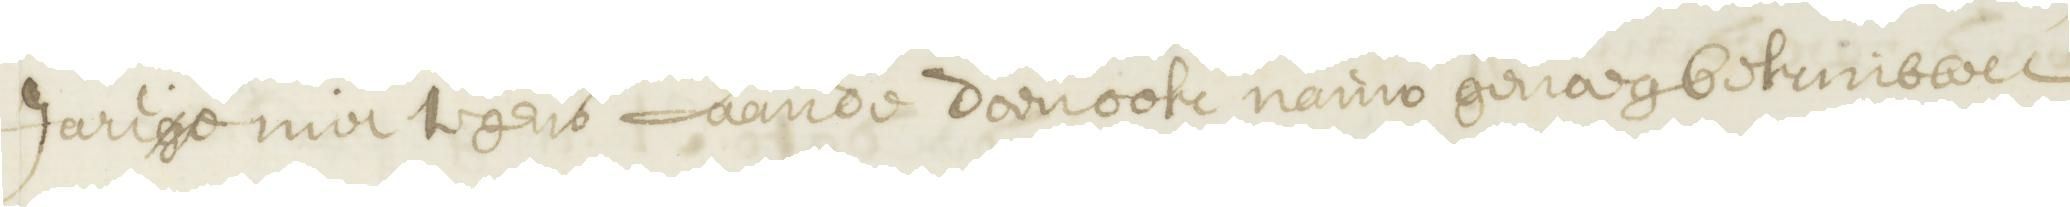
Jarege niet tegenstaande doen ook nauw genoeg beknibbelt
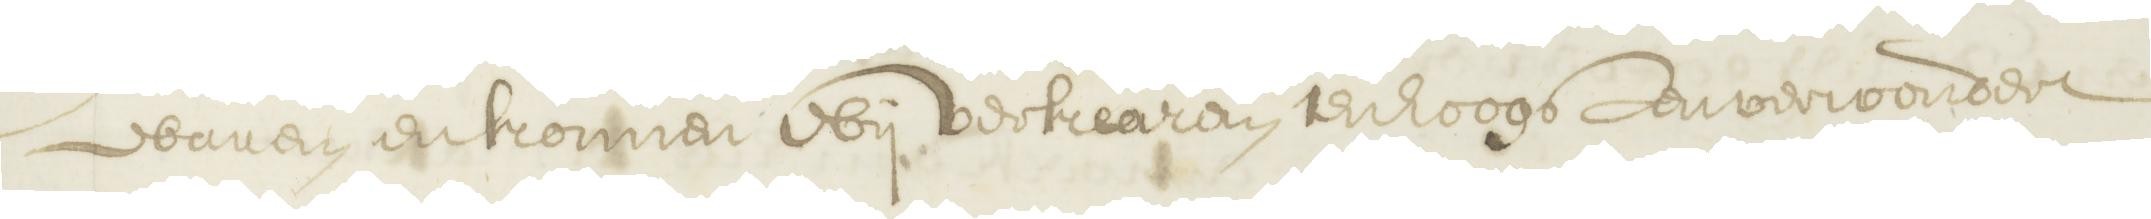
waren en konnen wij verklaren, ten hoogsten verwondert
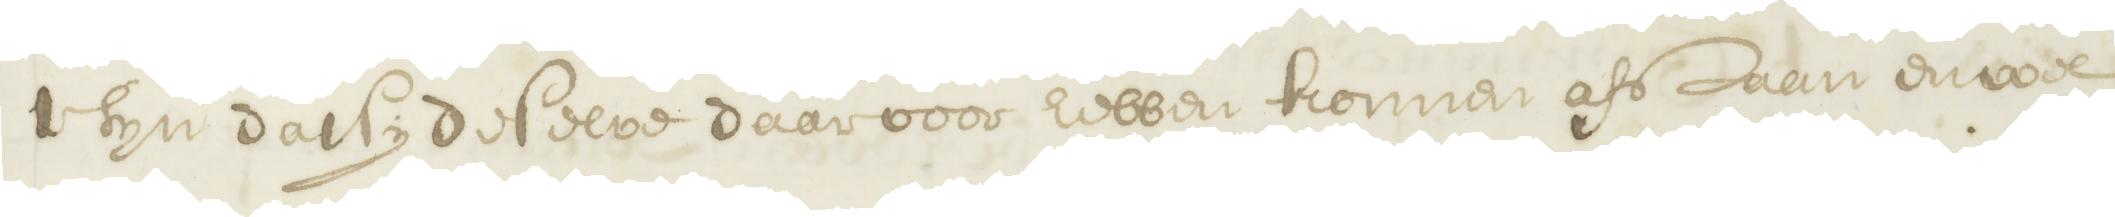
te sijn dat sij deselve daar voor hebben konnen afstaan en wel
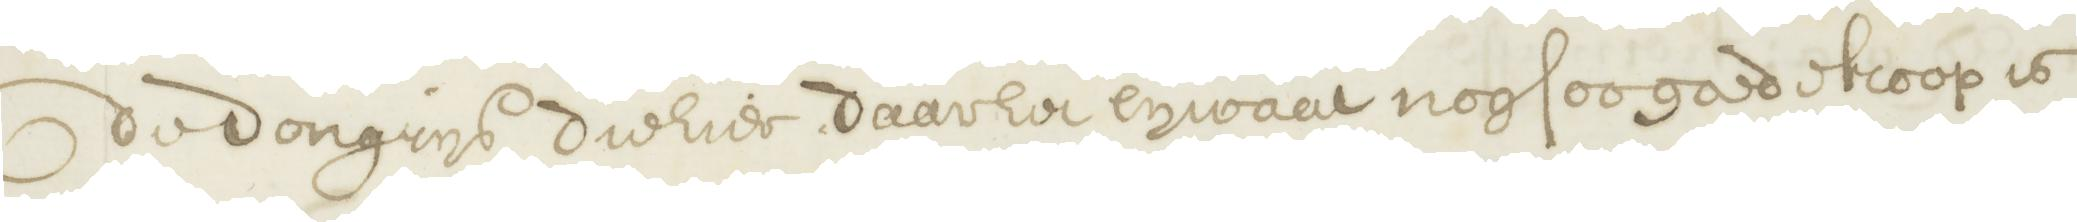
de dongrijs die hier daar het lijwaat nog soo goedekoop is
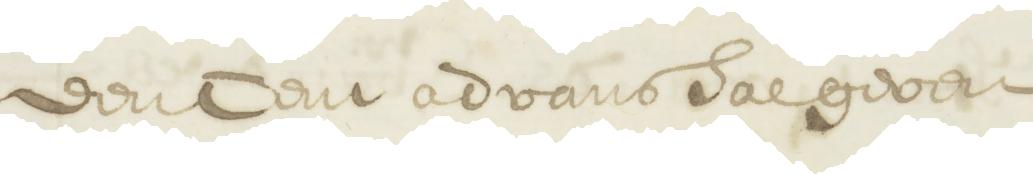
een Cent advans sal geven
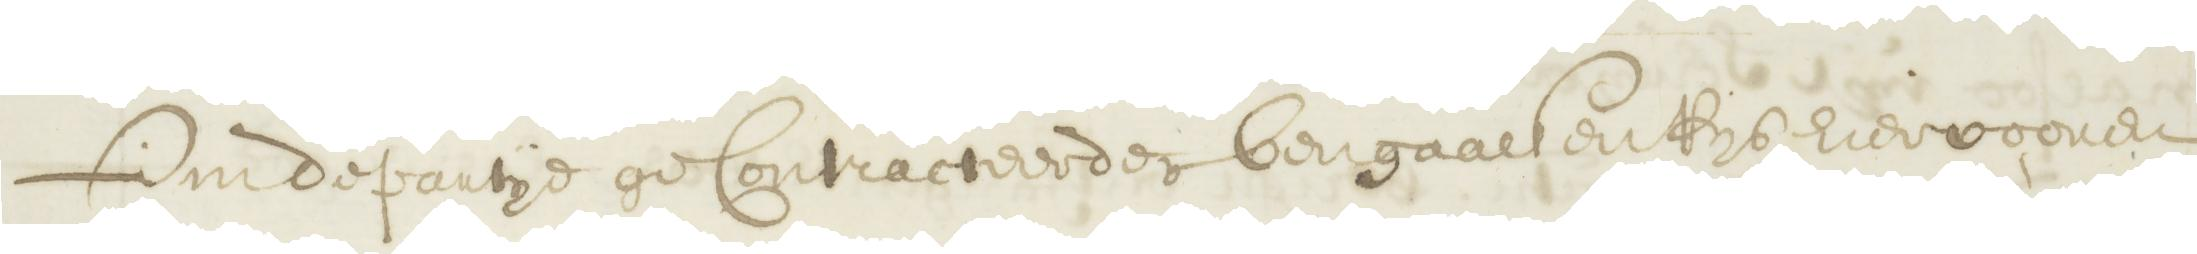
Om de partije gecontracteerden bengaals en Rijs hier voor en
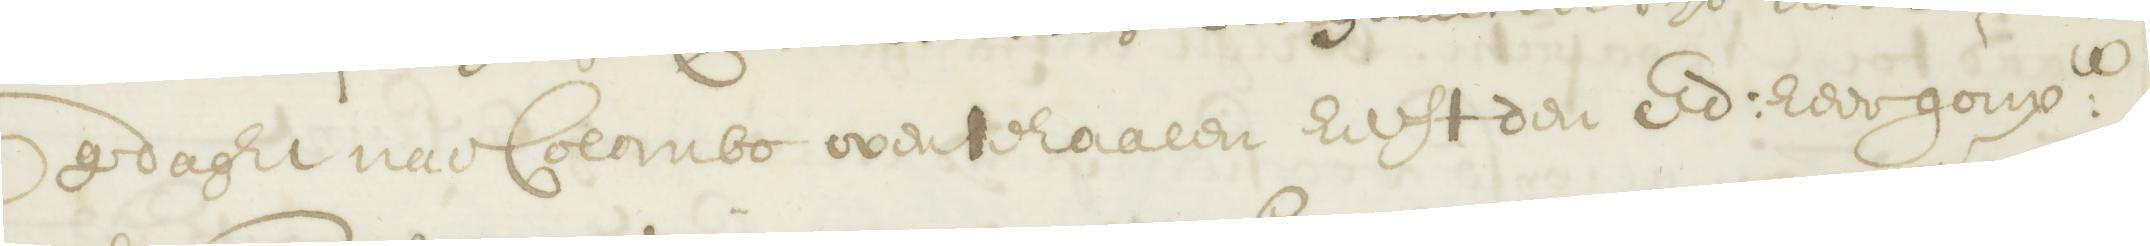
gedaght nae Colombo over te haalen heeft den Ed: heer gouv:e
